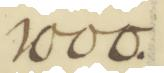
1000.
